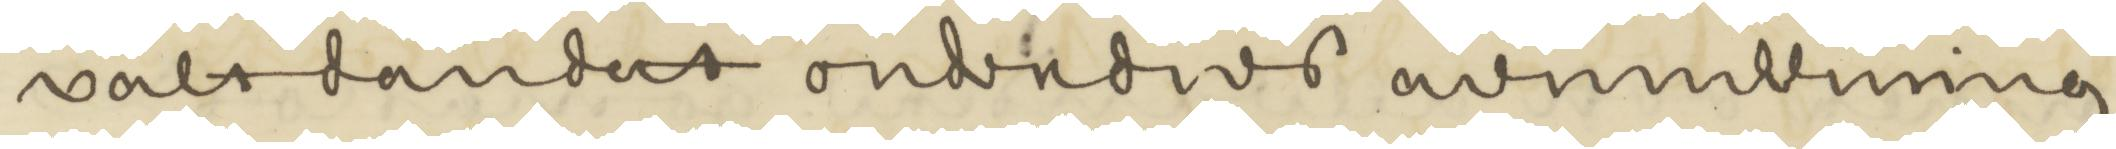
valt dan dat onder dies aenneeming
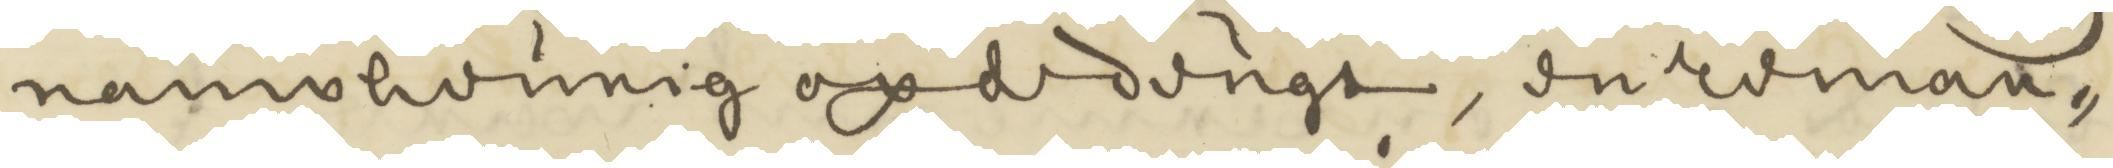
nauwkeurig op de deugt, en reman„
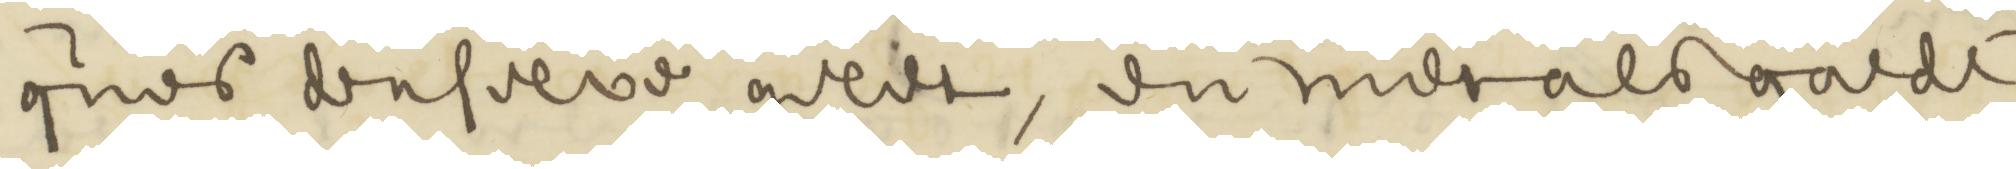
ques denselve gelet, en met als goede
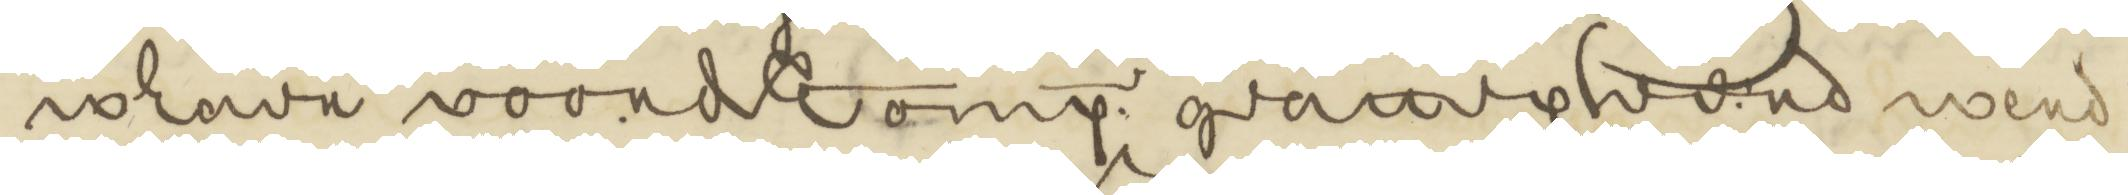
whaer voor dE Comp:e geaccepteerd werd
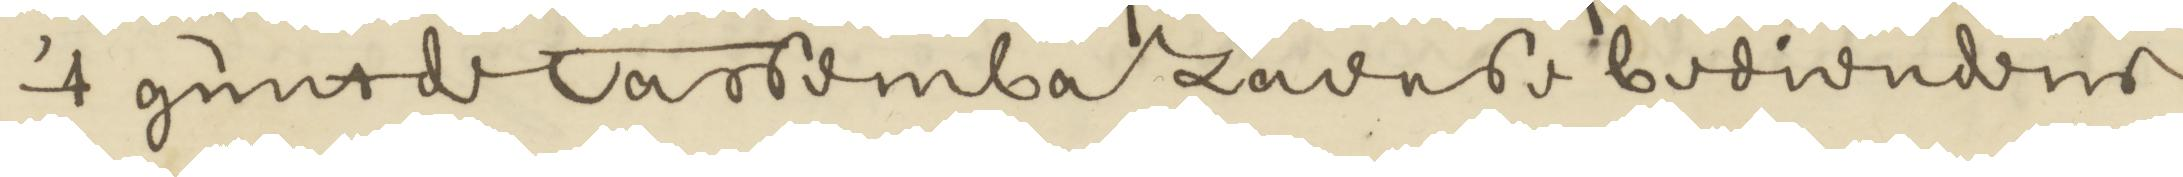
’t gunt de Cassemba zaerse bediendens
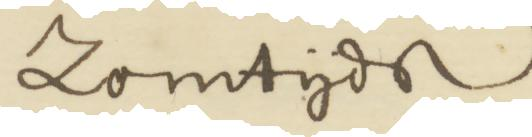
Zomtijds
